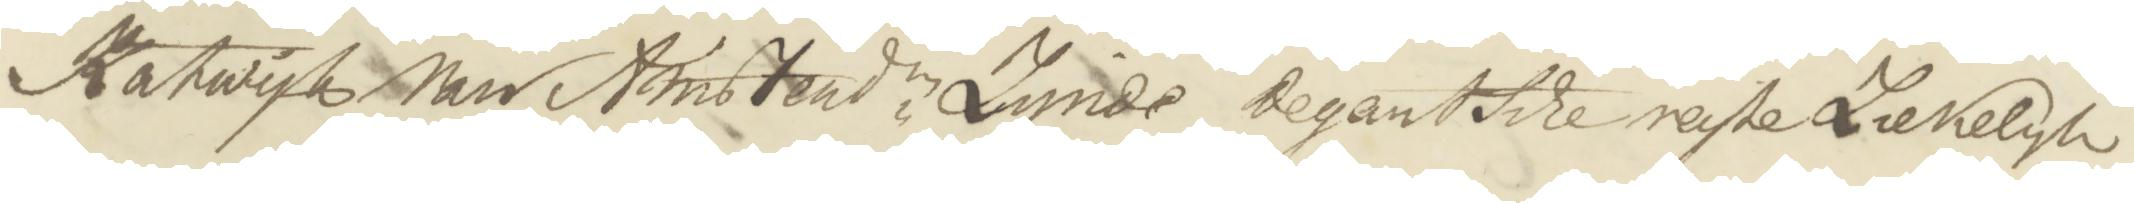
Katwijk van Amsterd„m zijnde degantsche reyze ziekelyk
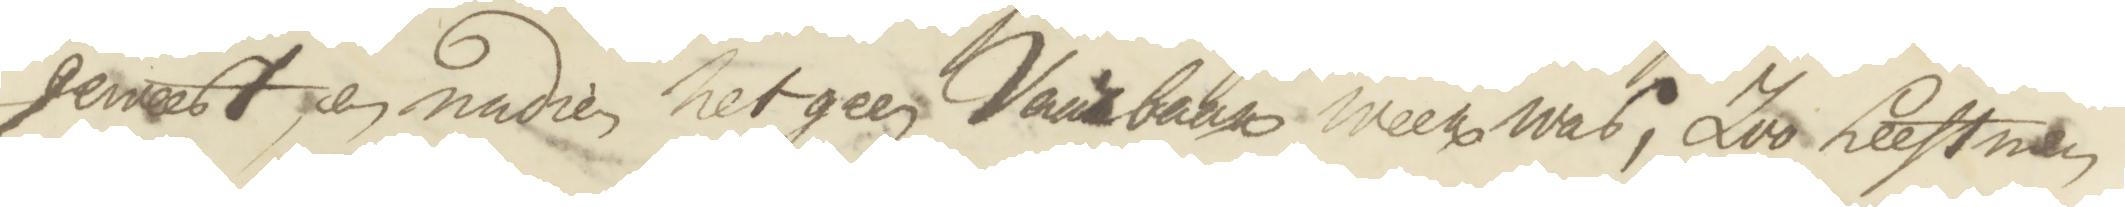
geweest, en nadien het geen vaarbaar weer was, zoo heeft men
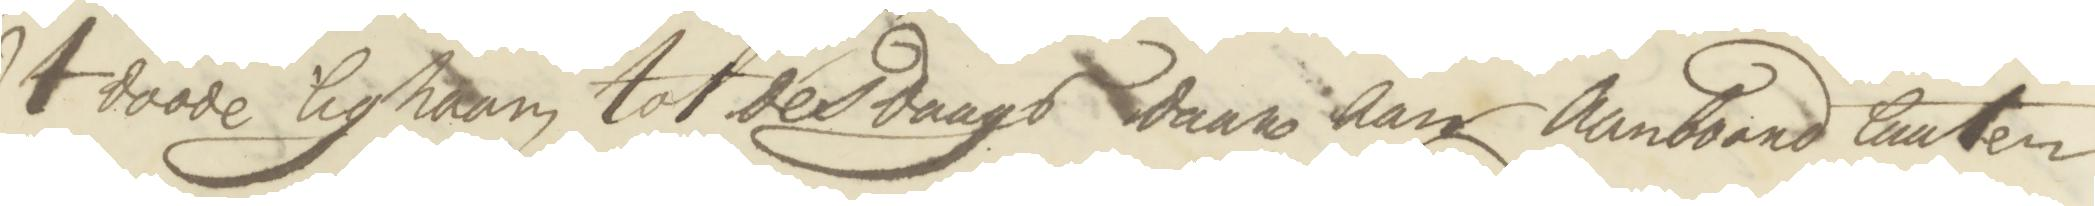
t doode lighaam tot des daags daar aan aanboard laaten
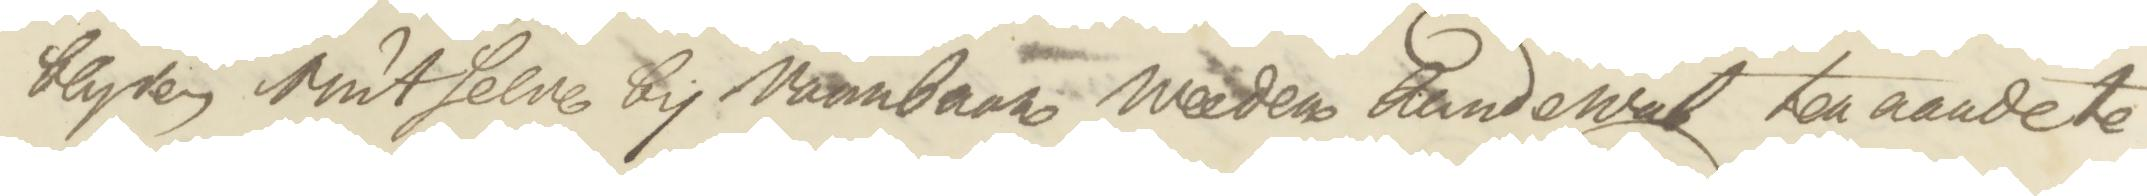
blyven om't selve bij vaarbaar weeder aandewal ter aarde te
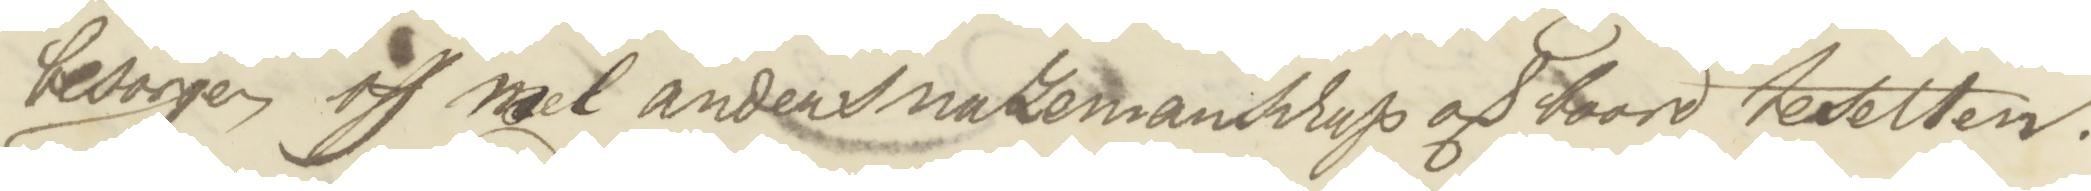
besorgen off wel anders nazemanschap over boord tesetten
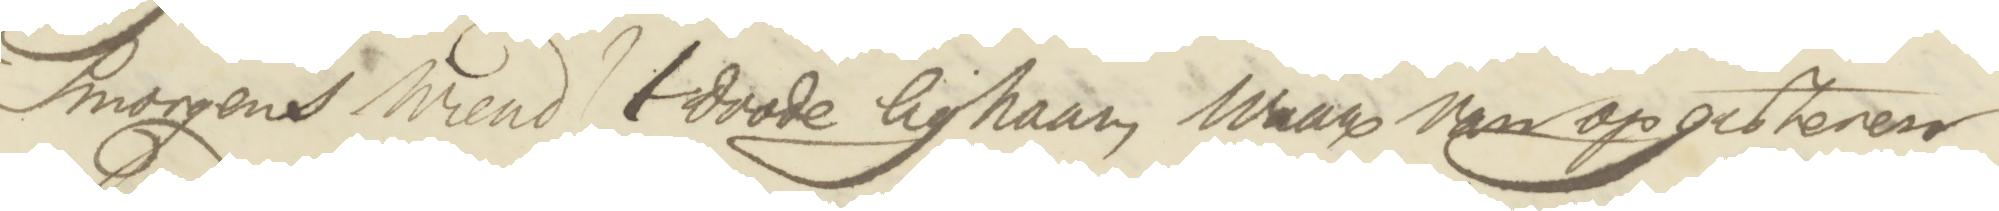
smorgens wierd ’t doode lighaam waar van op gisteren
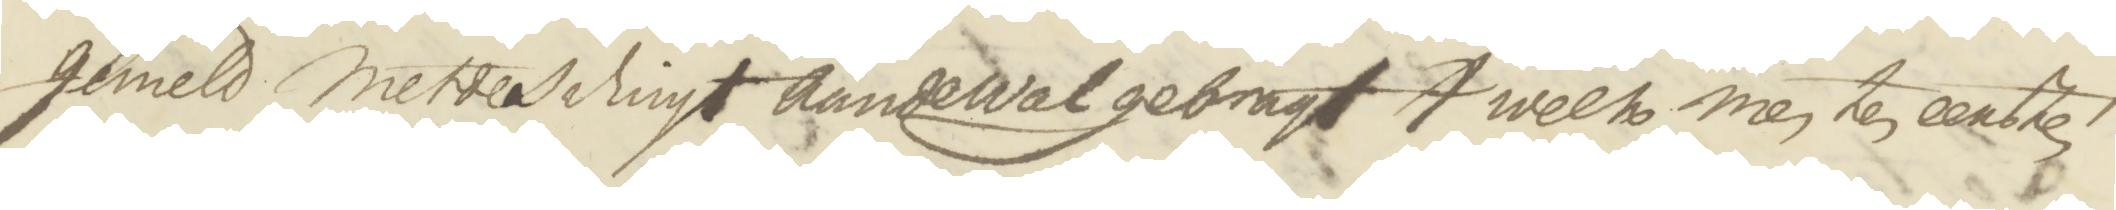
gemeld met de schuijt aandewal gebragt ’t welk men ten eersten
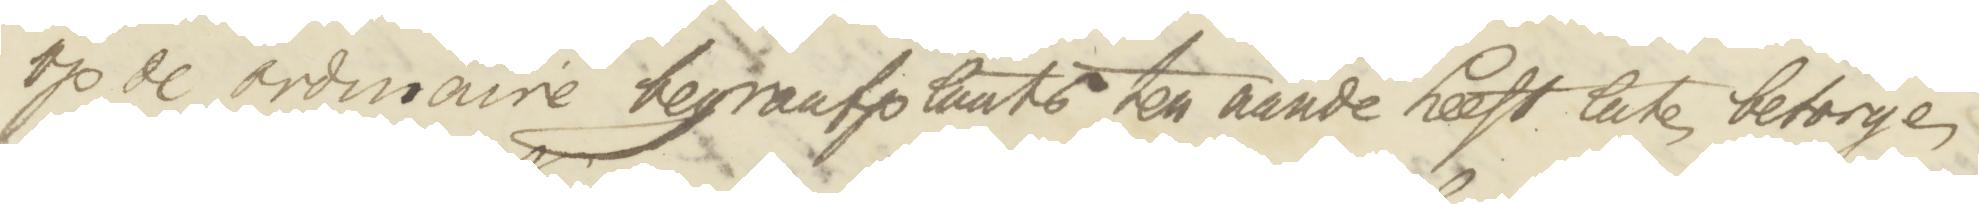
op de ordinaire begraafplaats ter aarde heeft laten besorgen
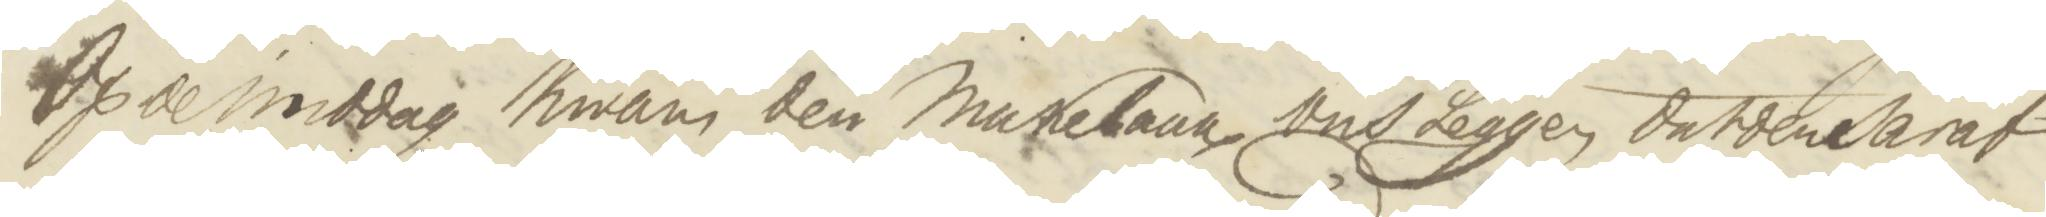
Op de middag kwam den makelaar ons seggen dat den saraf
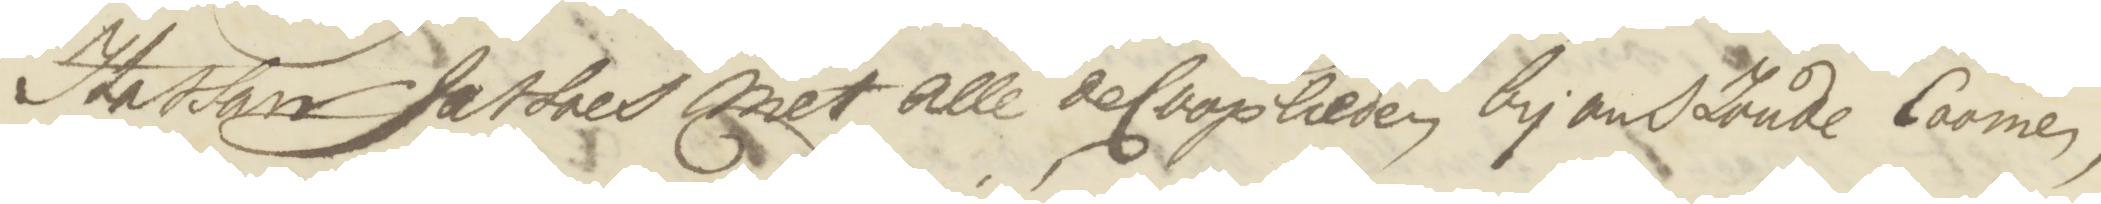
Hassan Jassoes met alle de Cooplieden bij ons zoude Coomen
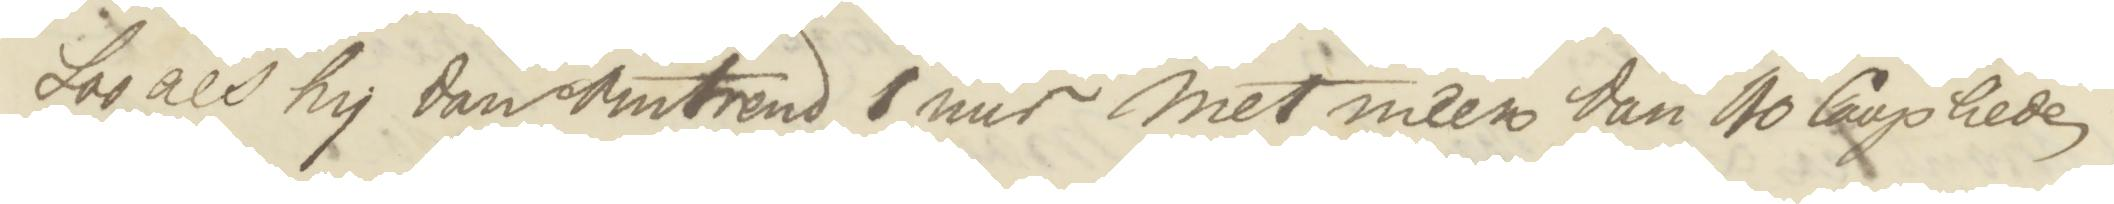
soo als hij dan omtrend 1 uur met meer dan 440 Cooplieden
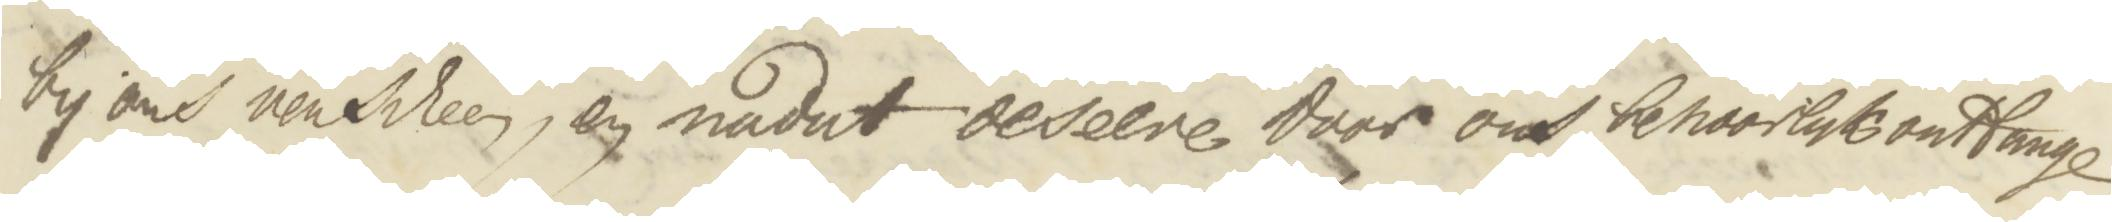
by ons verscheen, en nadat deselve door ons behoorlyk ontfangen
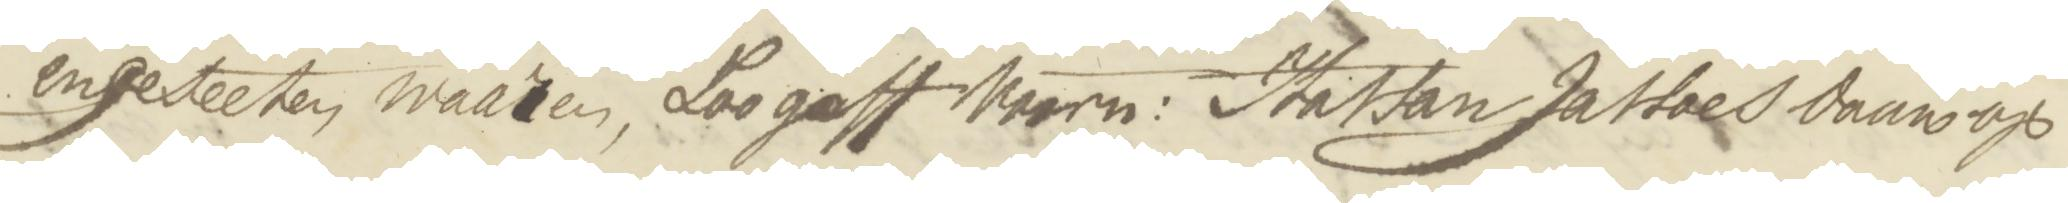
en geseeten waaren, soo gaff voorn: Hassan Jassoes daar op
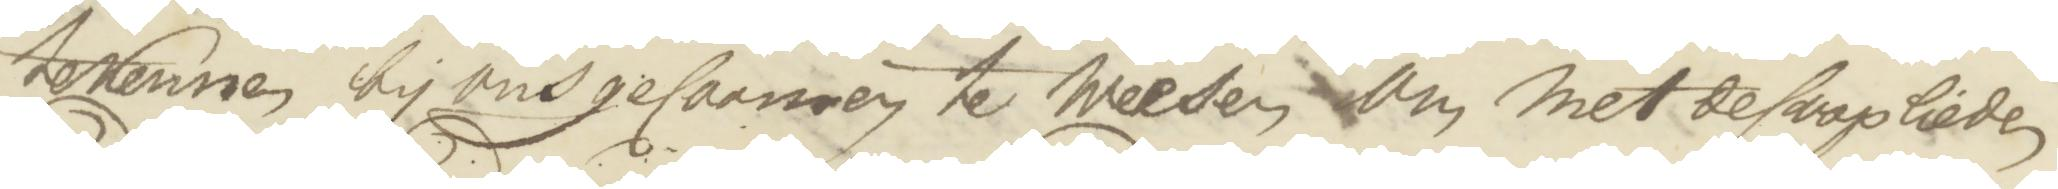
tekennen bij ons gecoomen te weesen om met de Cooplieden
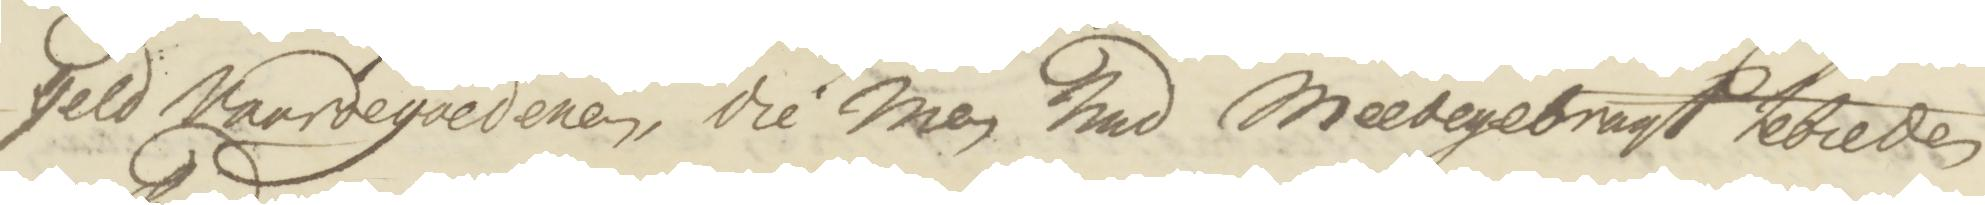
geld voor de goederen, die men had meedegebragt tebieden
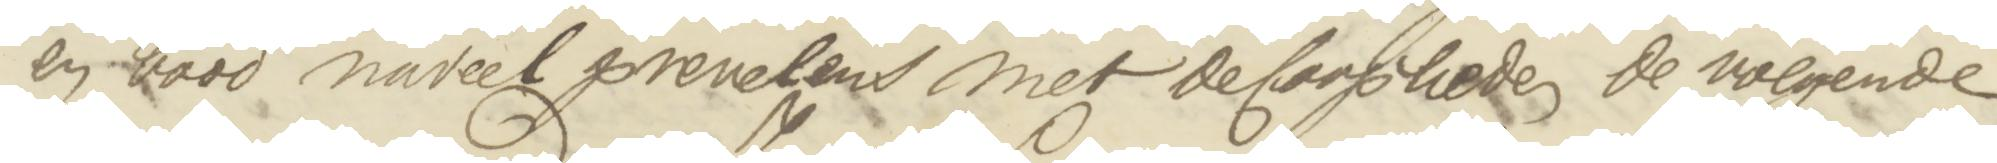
en bood naveel prevelens met de Cooplieden de volgende
